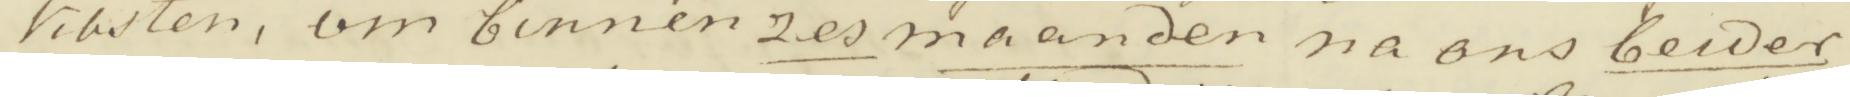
kosten, om binnen zes maanden na ons beider
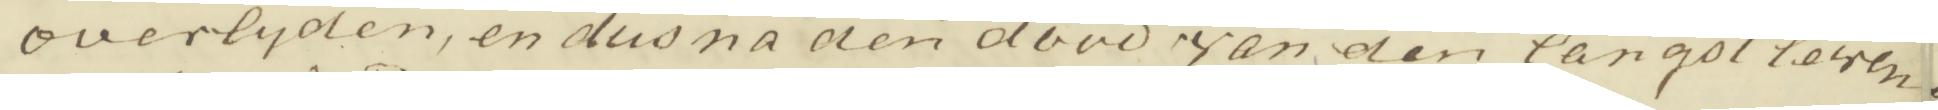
overlyden, en dus na den dood van den langst leven
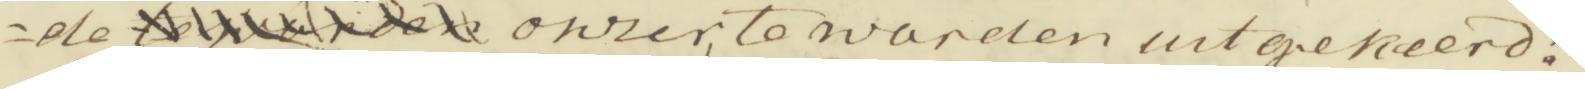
=de te worden onzer, te worden uitgekeerd:
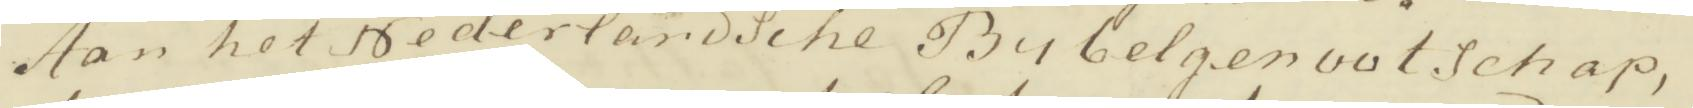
Aan het Nederlandsche Bybelgenootschap,
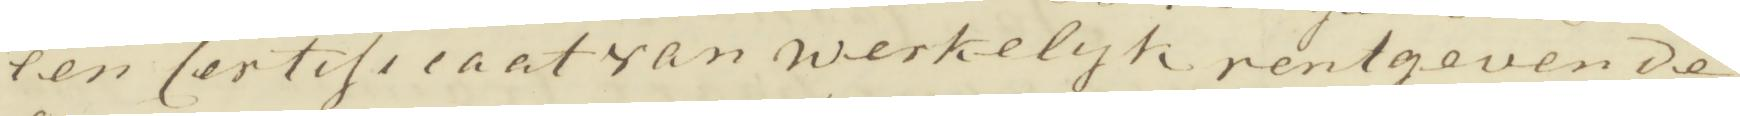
een Certificaat van werkelyk rentgevende
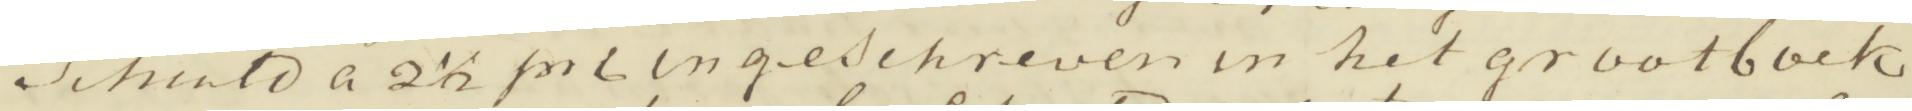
schuld a 2½ pct ingeschreven in het grootboek
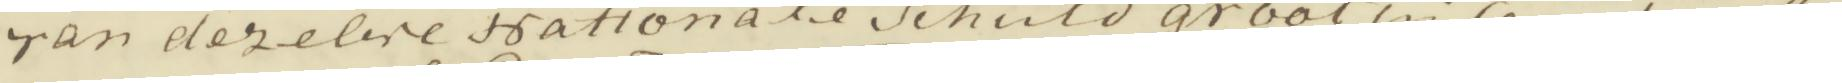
van dezelve Nationale schuld groot in Capitaal.
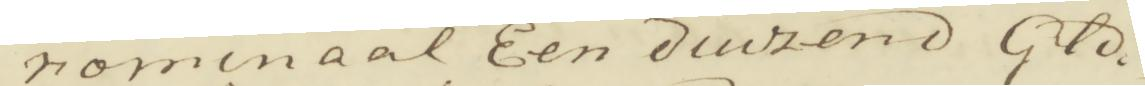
nominaal Een duizend Gld.
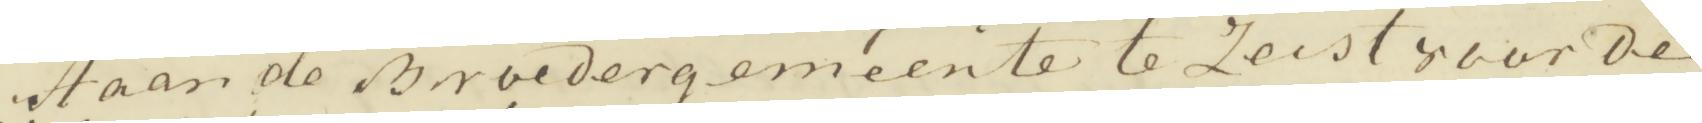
Aaan de Broedergemeente te Zeist voor de
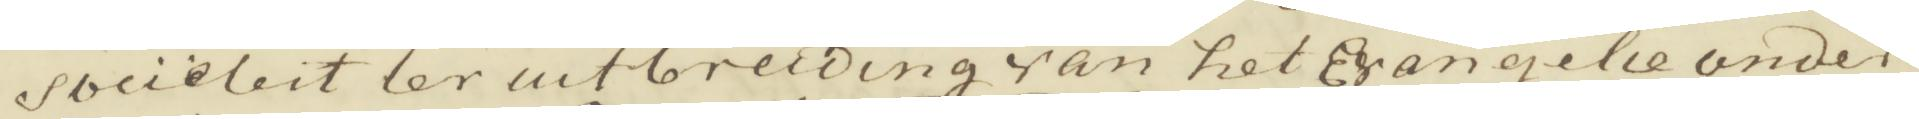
sociëteit ter uitbreiding van het Evangelie onder
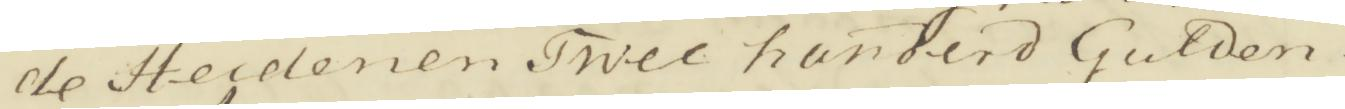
de Heidenen Twee honderd Gulden.
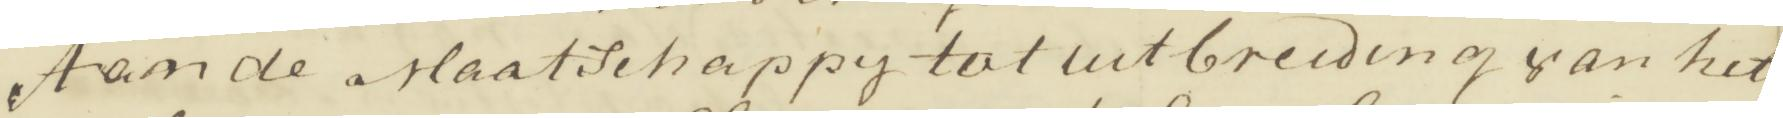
Aan de Maatschappy tot uitbreiding van het
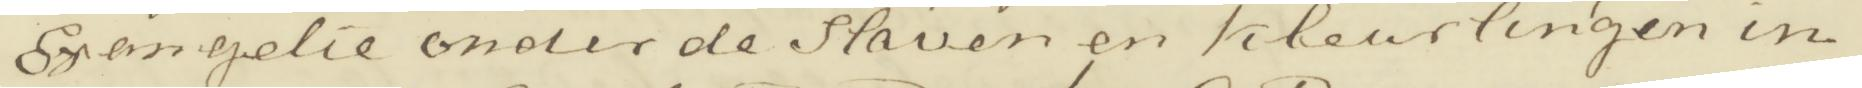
Evangelie onder de Slaven en Kleurlingen in
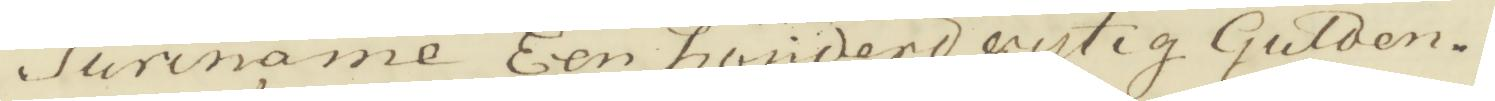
Suriname Een honderd vytig Gulden.
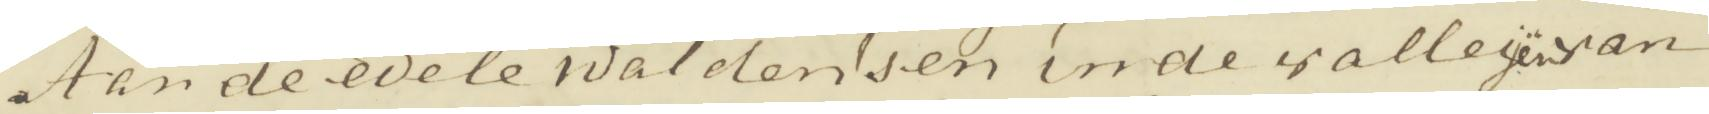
Aan de edele Waldensen in de valleijen van
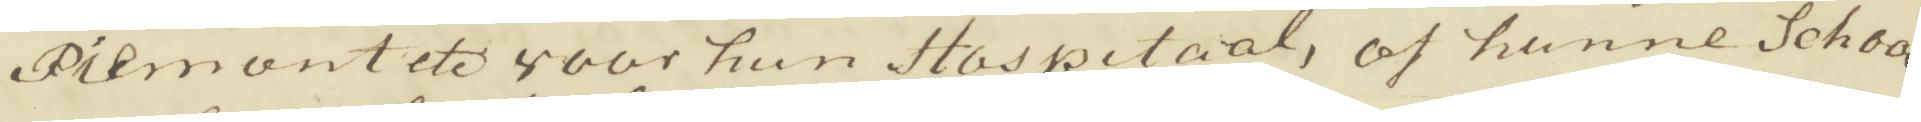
Pïemonte voor hun Hospitaal, of hunne School
